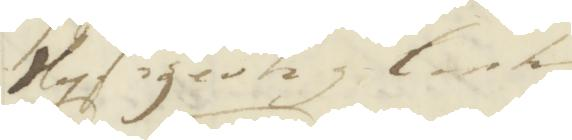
Vyfenzestig Cent
